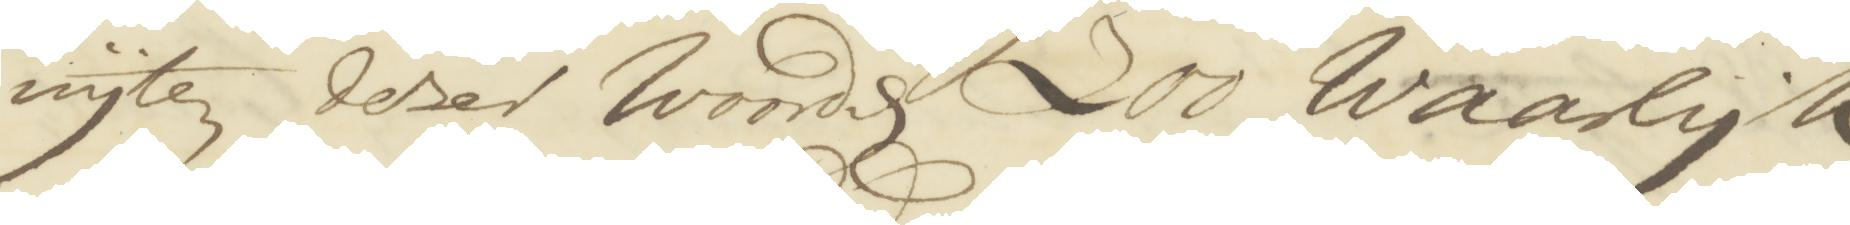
uijten dezer woorden Zoo waarlijk
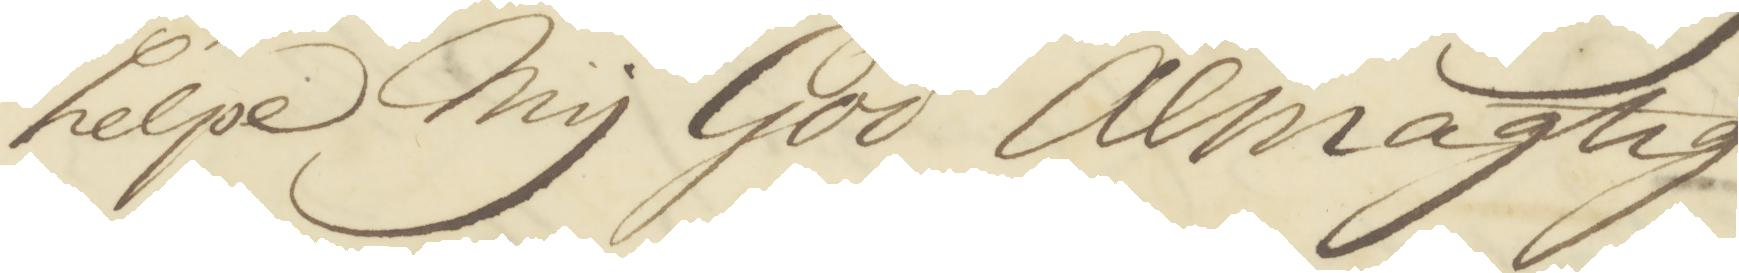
helpe mij God Almagtig
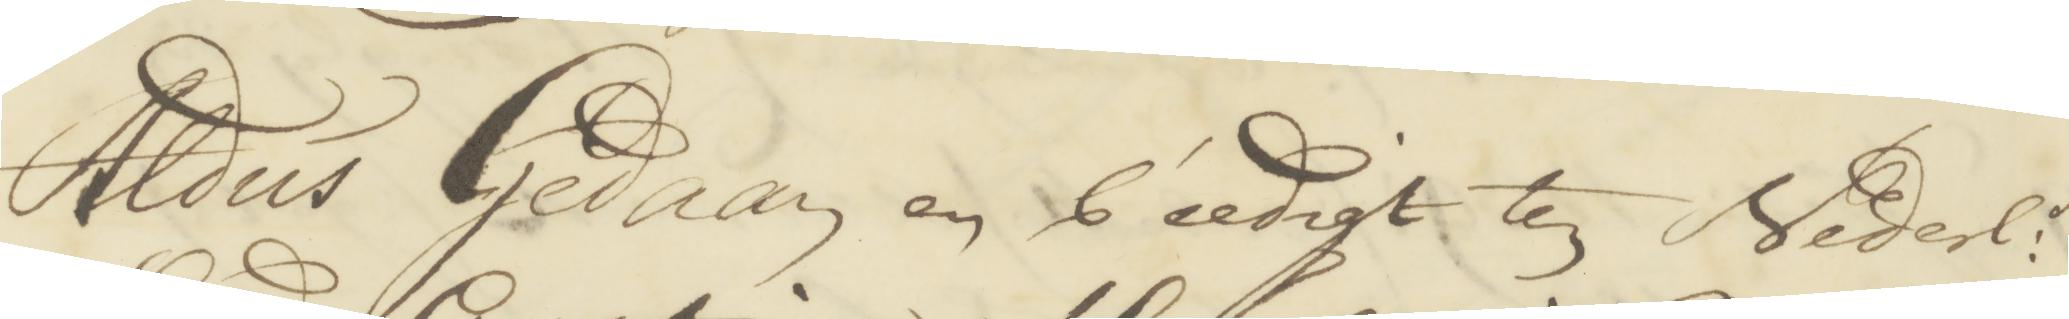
Aldus Gedaan en b'eedigt ten Nederl:'
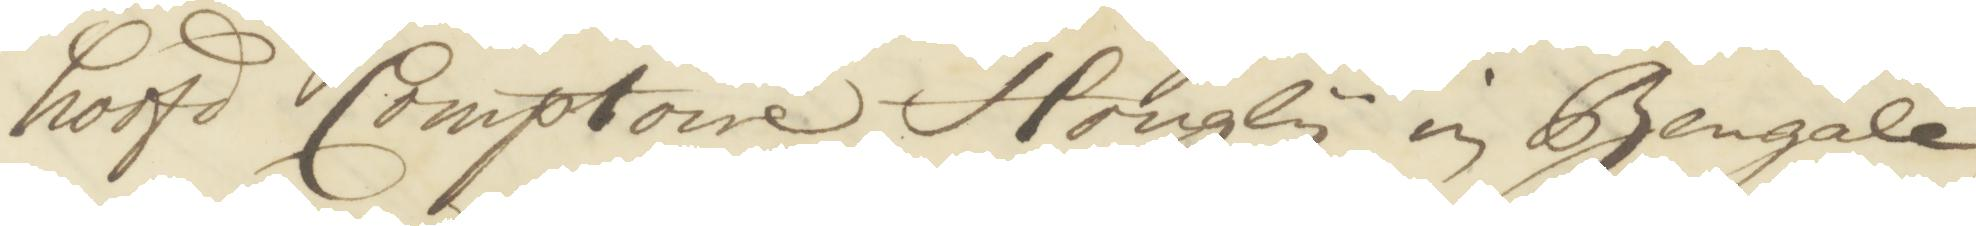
hoofd Comptoire Houglij in Bengale
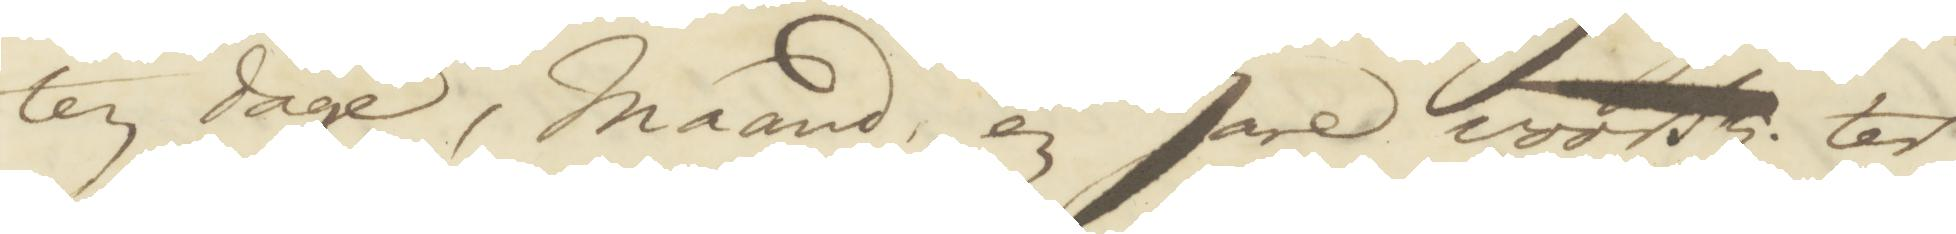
ten dage, maand, en Jare voorsz: ter
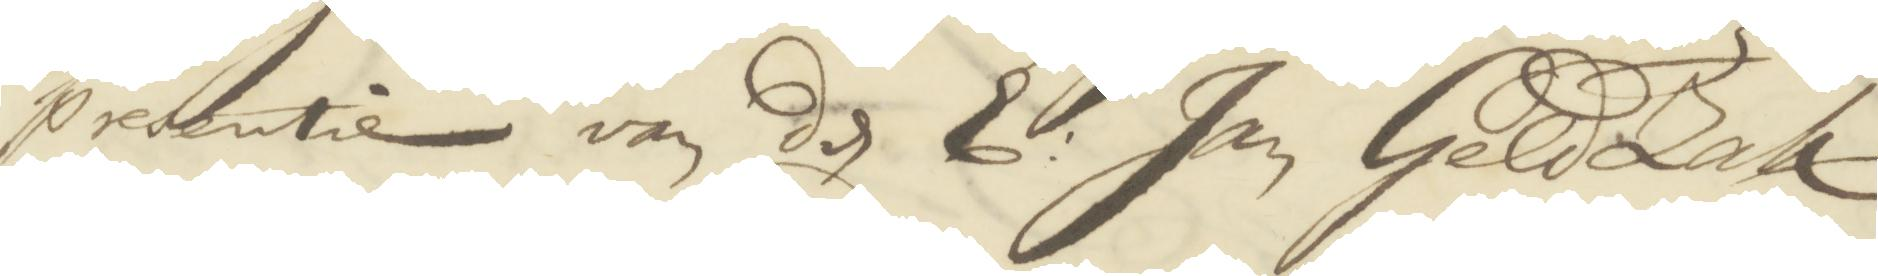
presentie van den E: Jan Geldzak
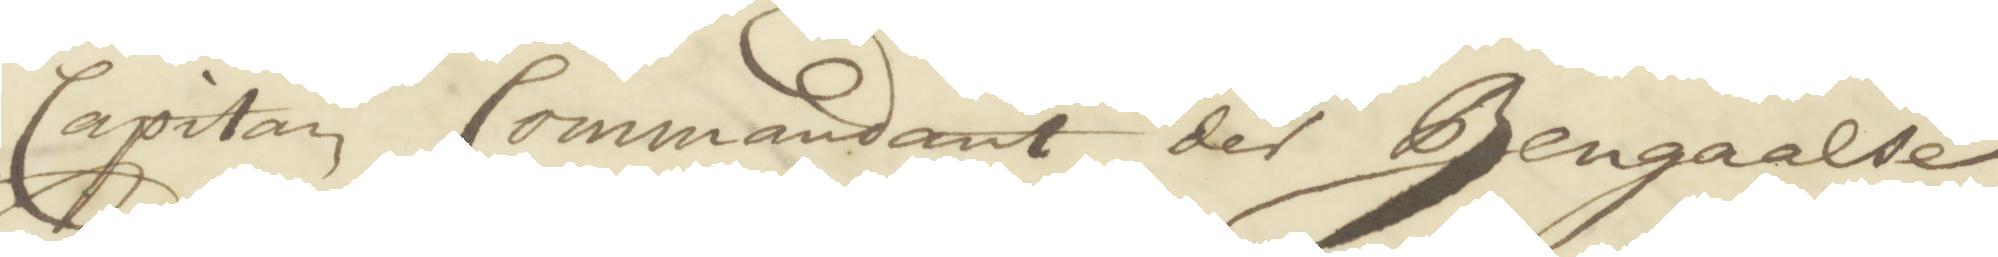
Capitain Commandant der Bengaalse
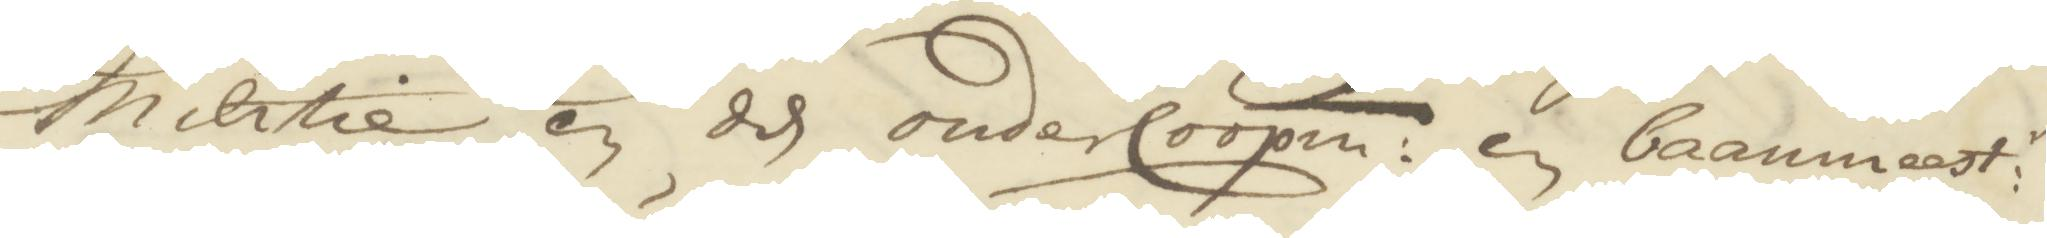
militie en den ondercoopm: en baanmeest:r
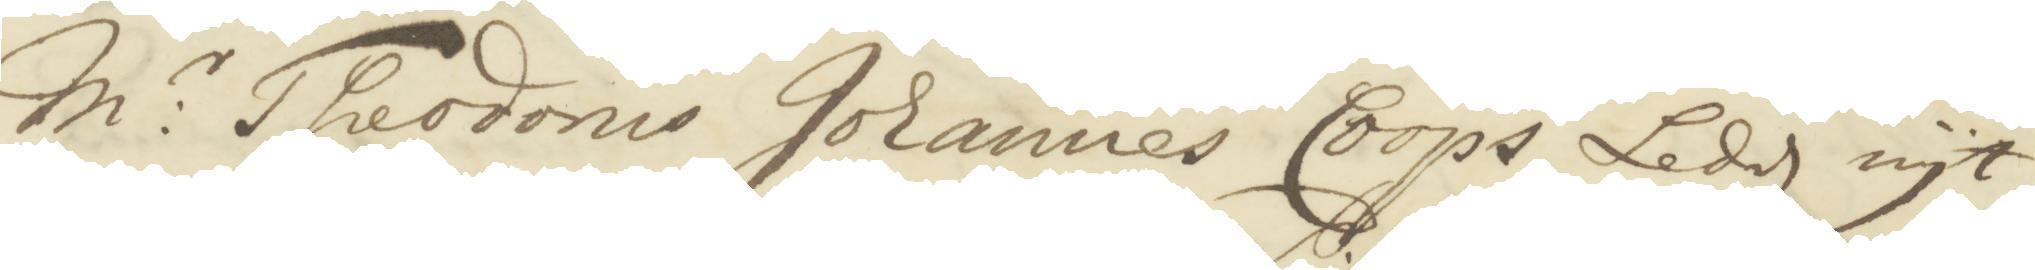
M:r Theodorus Johannes Coops, Leden uijt
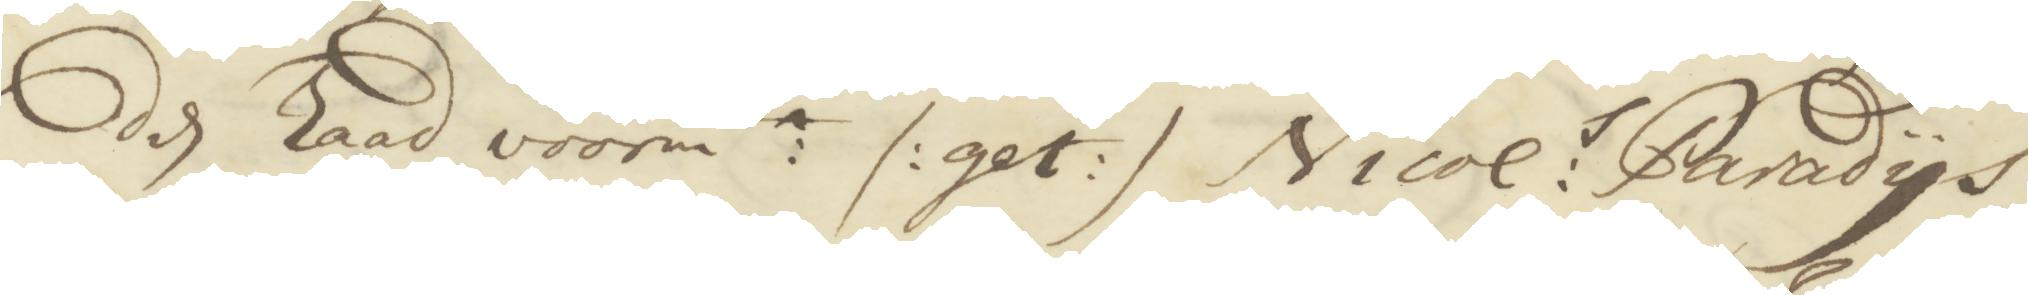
den raad voorm:t /:get:/ Nicol:s Paradijs
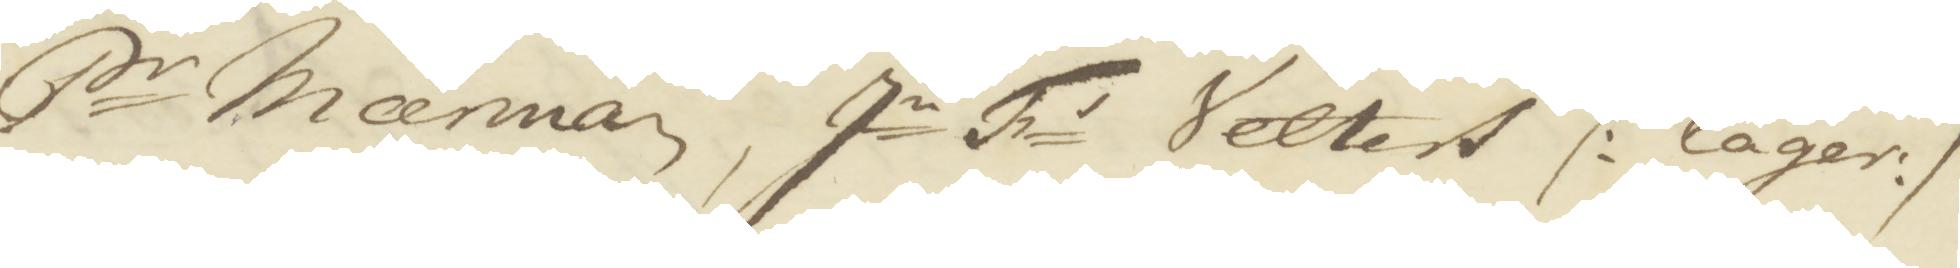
P=r Meerman, J=n F=s Velters /:lager:/
